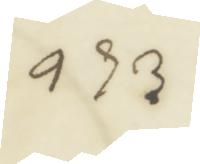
473
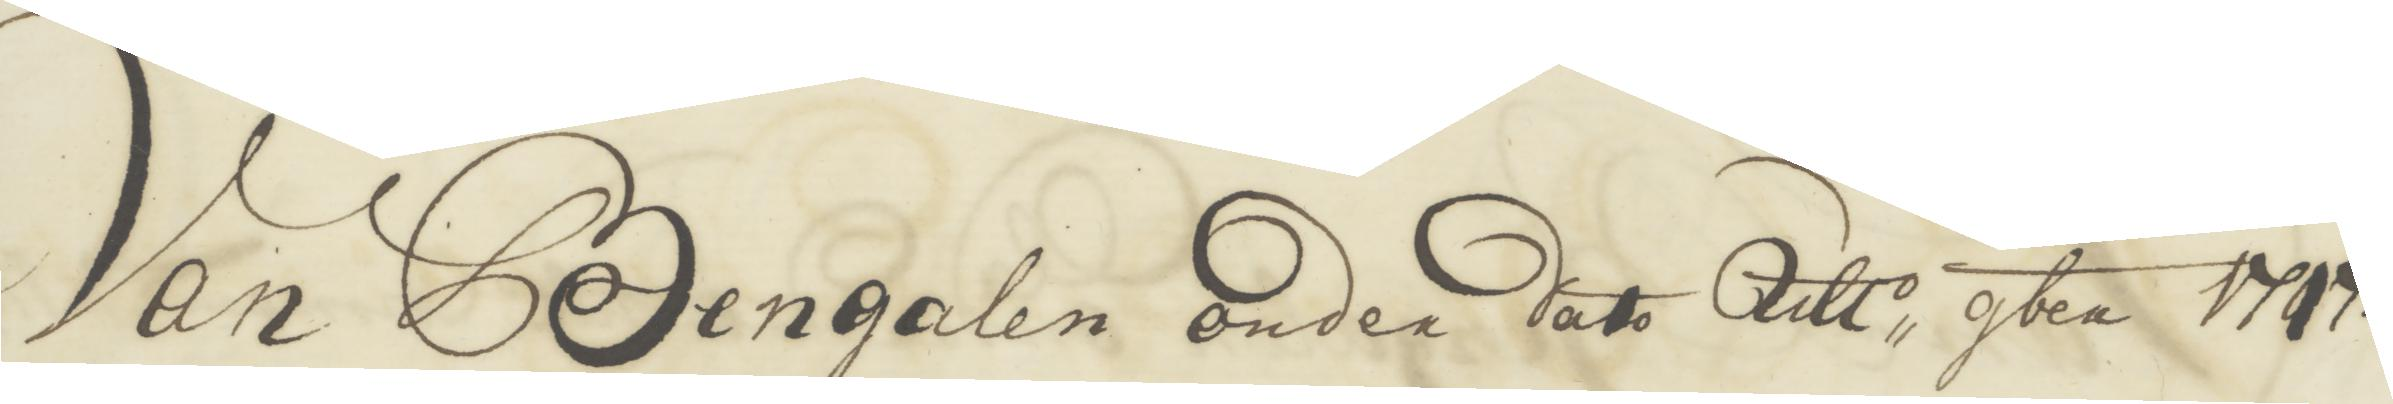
Van Bengalen onder dato ult„o 9ber 1747.
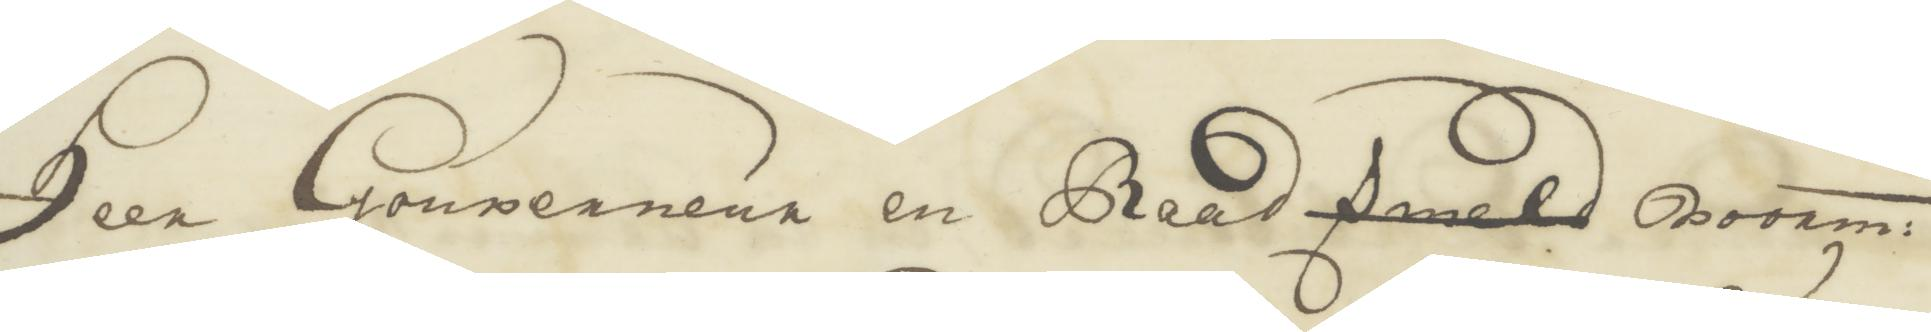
Heer Gouverneur en Raad vermeld voorm:
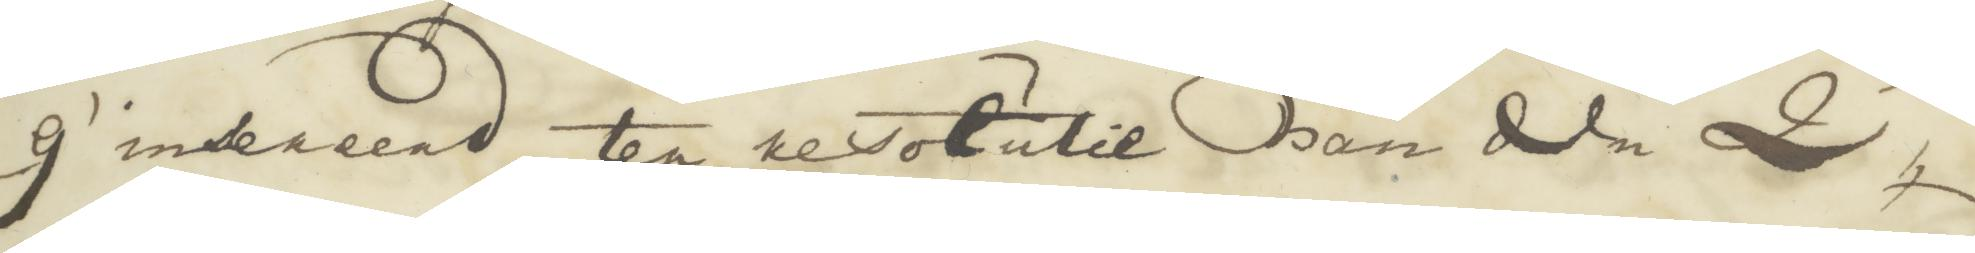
g’insereerd ter resolutie van den 2„'
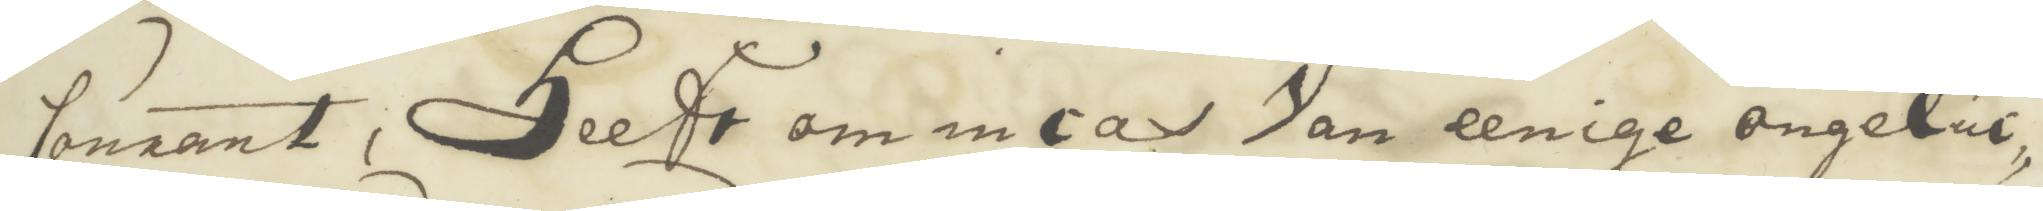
Courant, Heeft om incas van eenige ongeluc„
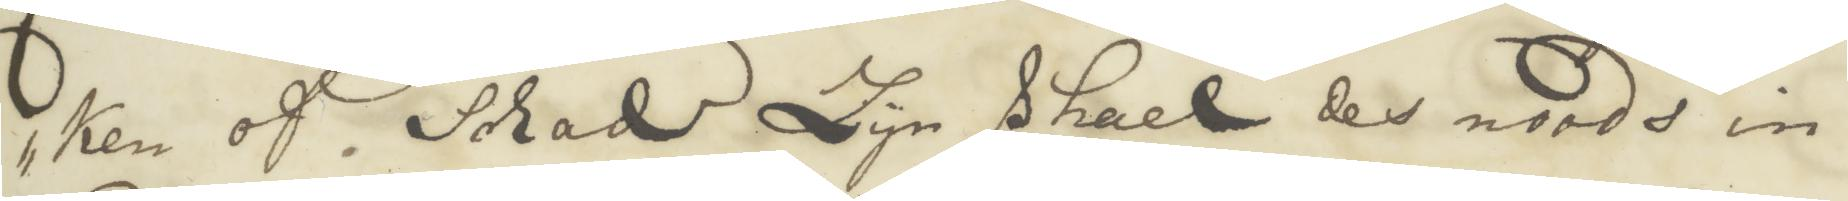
„ken of schade zijn verhael des noods in
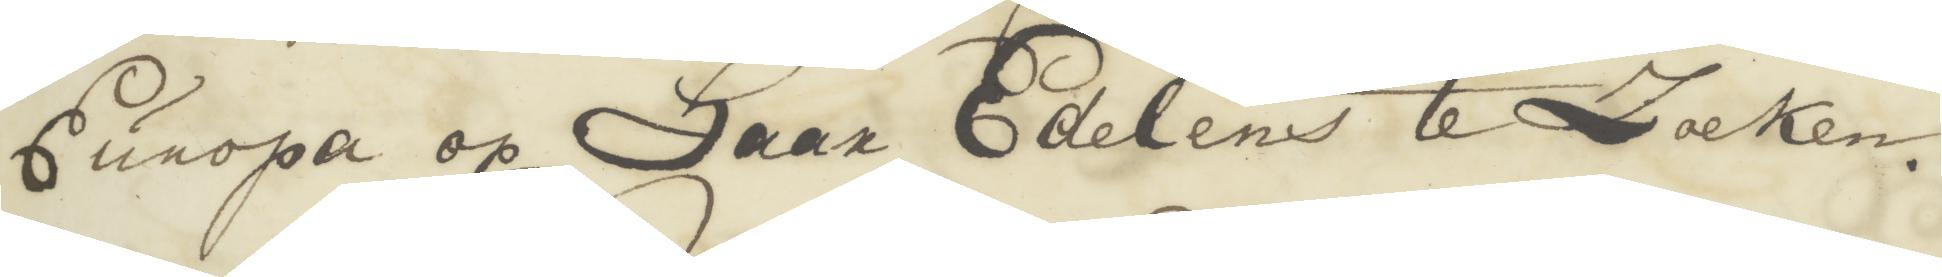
Europa op Haar Edelens te zoeken.
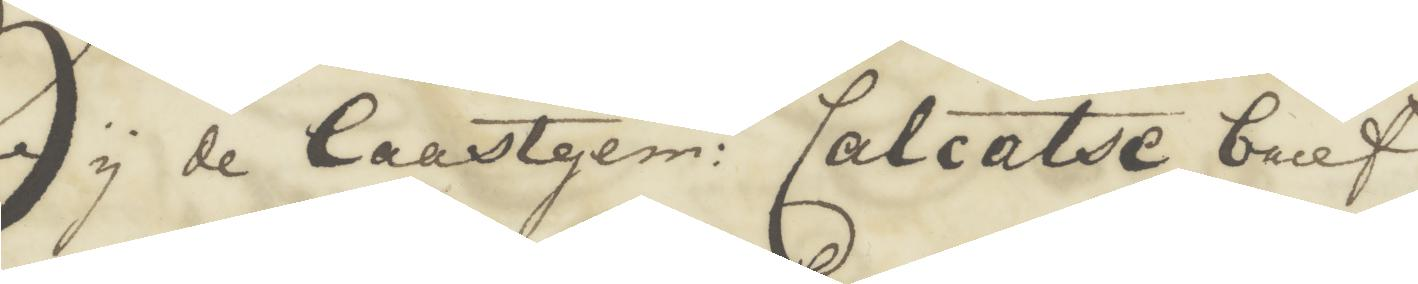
Bij de laastgem: Calcatse brief
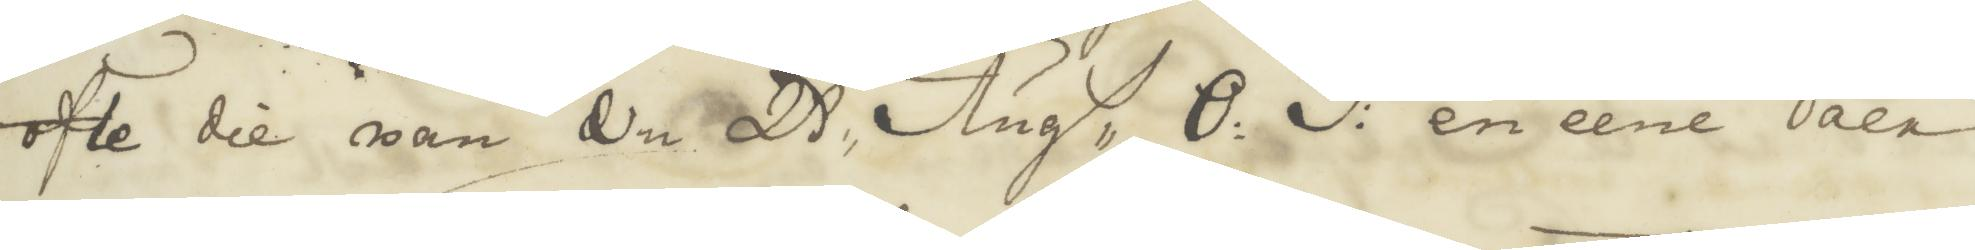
ofte die van den 28„' Aug„s O: S: en eene daer
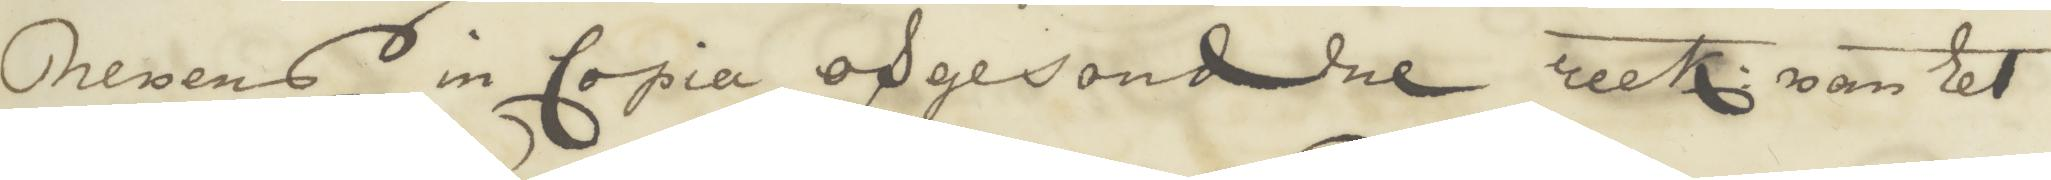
nevens in Copia overgesondene reek: van het
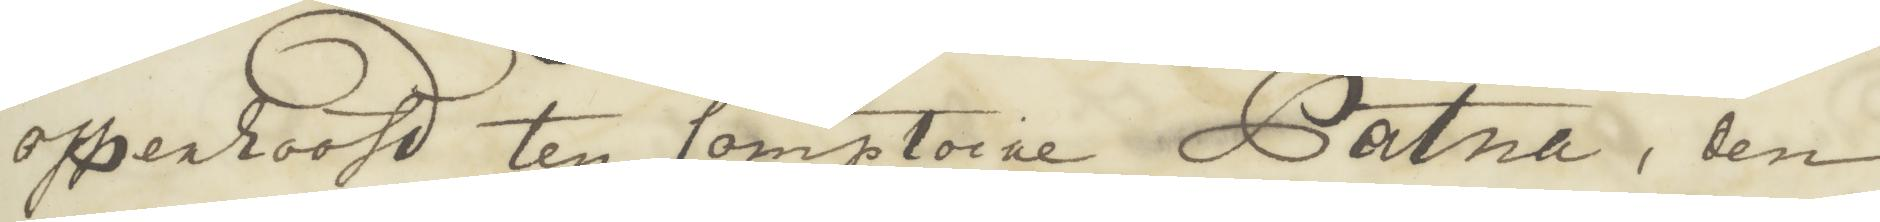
opperhoofd ten Comptoire Patna, den
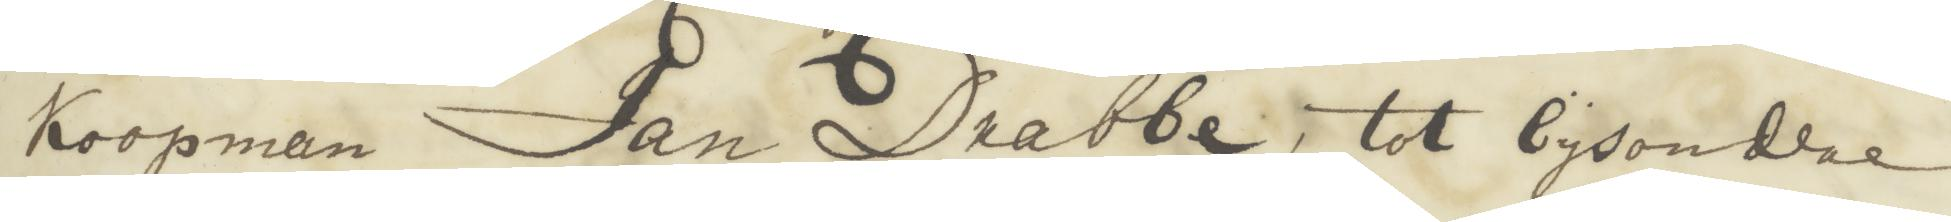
koopman Jan Drabbe, tot bijsondere
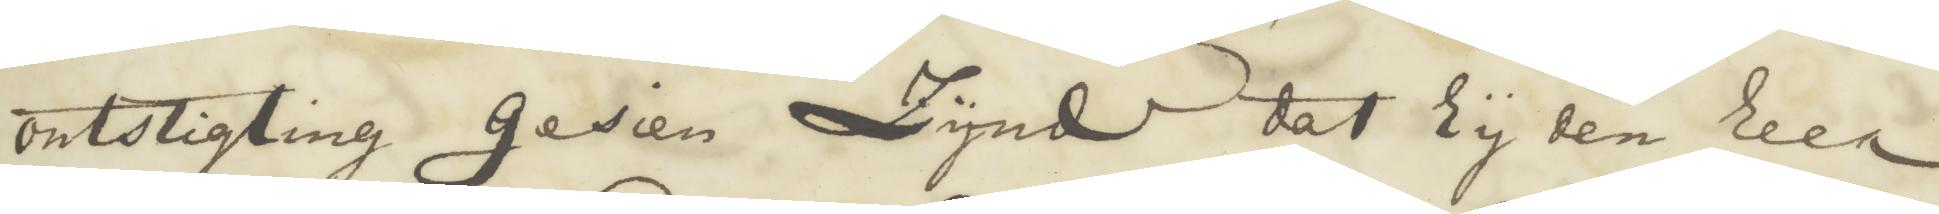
ontstigting gesien zijnde dat hij den heer
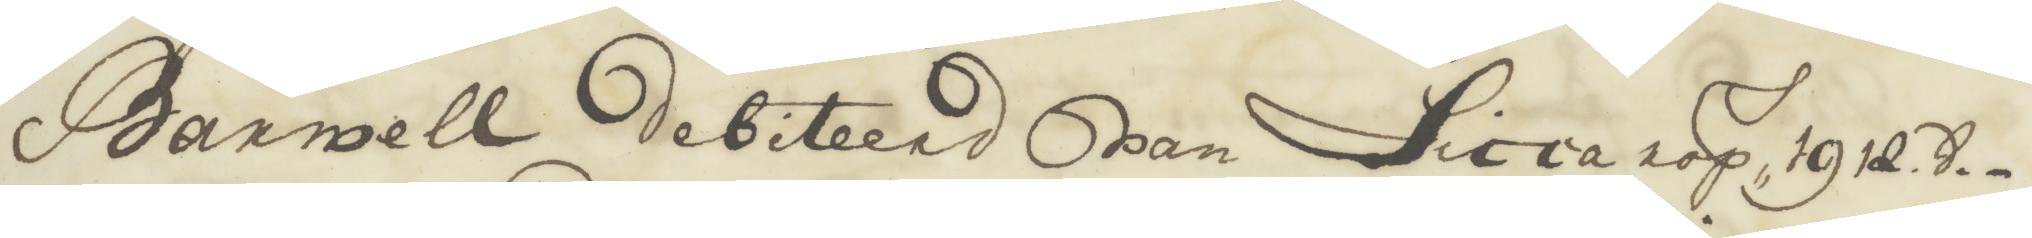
Barwell debiteerd van Sicca rop„s 1912.8. –
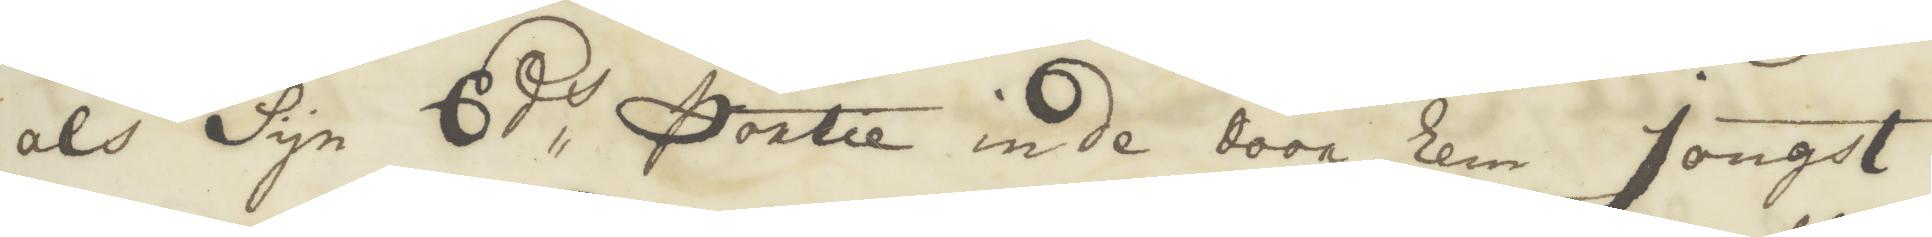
als sijn Ed„s portie in de door hem jongst
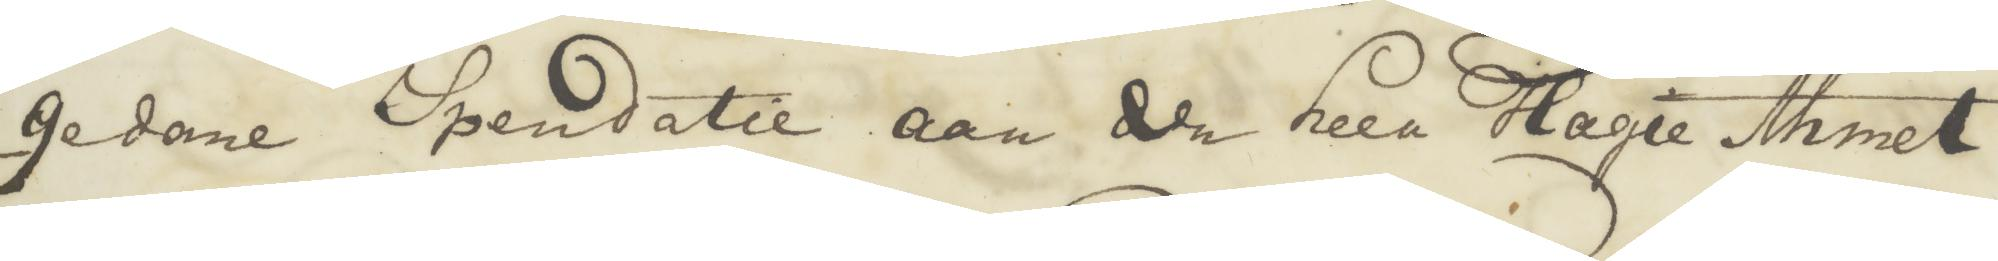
gedane spendatie aan den heer Hagie Ahmet
